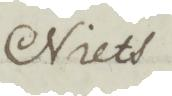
Niets
